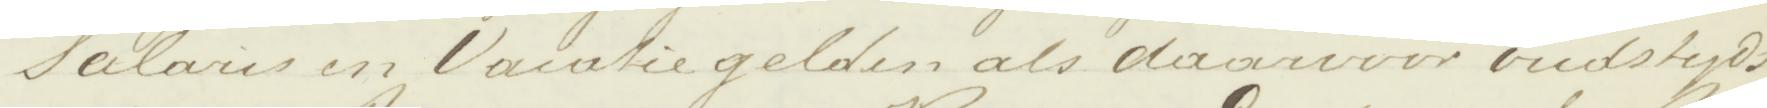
Salaris en Vacatie gelden als daarvoor oudstyds
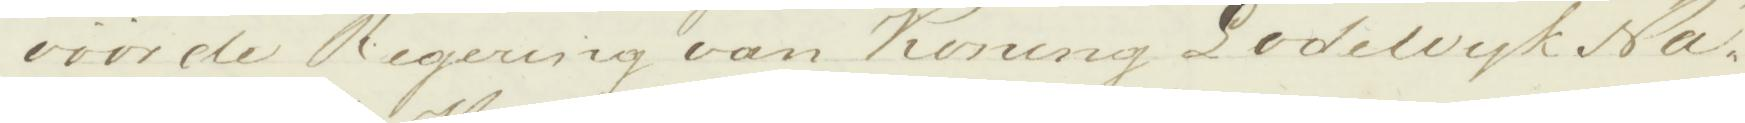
voor de Regering van Koning Lodewyk Na„
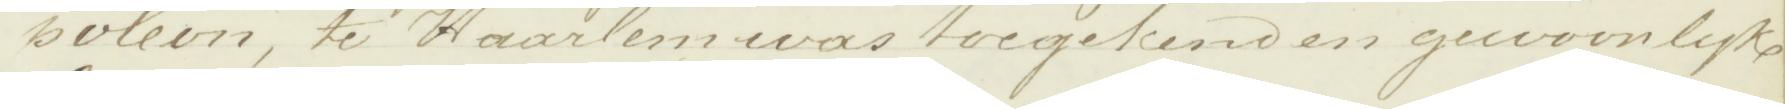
poleon, te Haarlem was toegekend en gewoonlyk
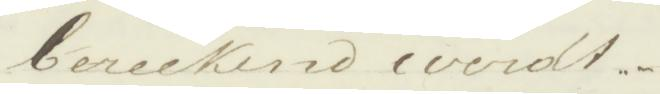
bereekend wordt.
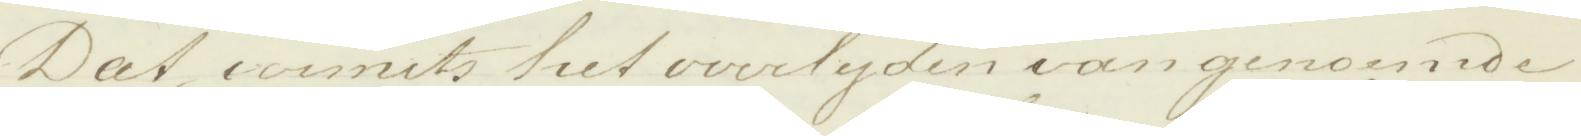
Dat, vermits het overlyden van genoemde
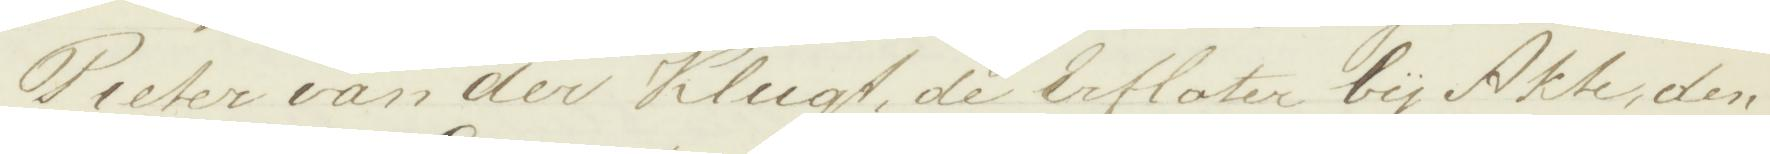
Pieter van der Klugt, de Erflater bij Akte, den
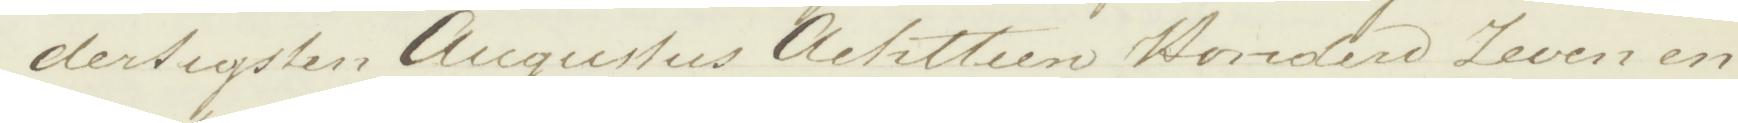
dertigsten Augustus Achttien Honderd Zeven en
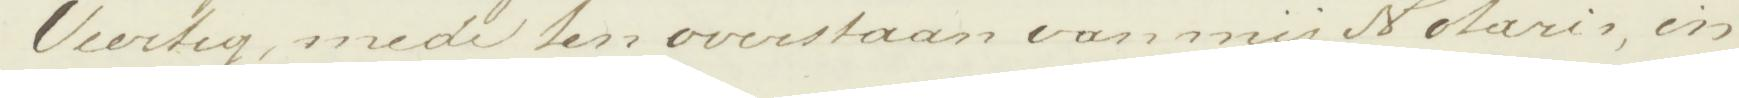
Viertig, mede ten overstaan van mij Notaris, in
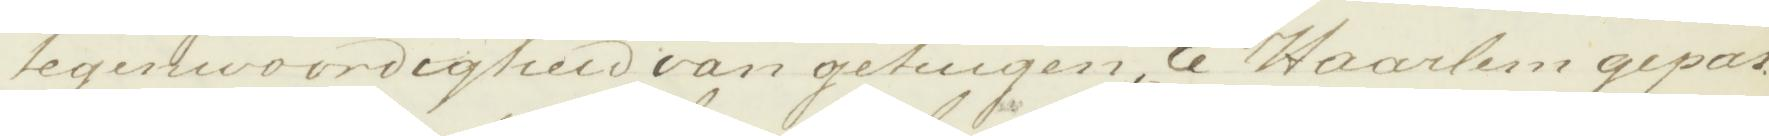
tegenwoordigheid van getuigen, te Haarlem gepas
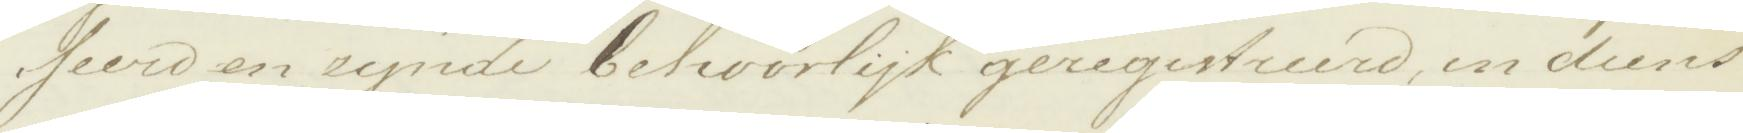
,seerd en zynde behoorlyk geregistreerd, in diens
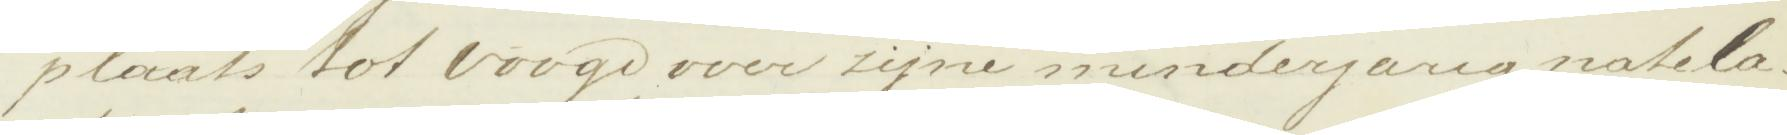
plaats tot voogd over zyne minderjarig natela
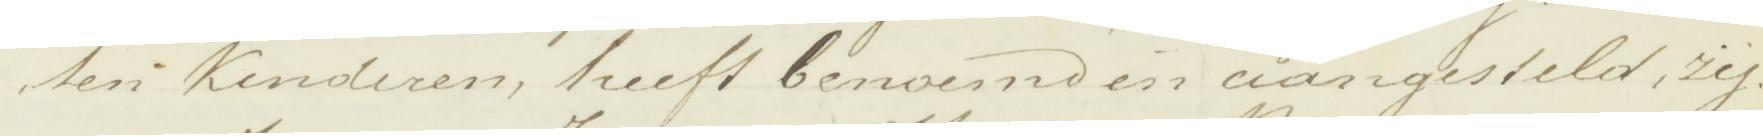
,ten kinderen, heeft benoemd en aangesteld, zij
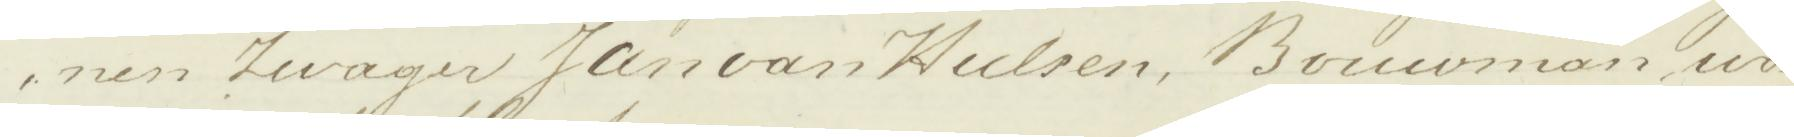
„nen Zwager Jan van Hulsen, Bouwman, wo
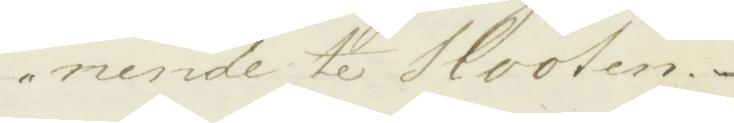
„nende te slooten.
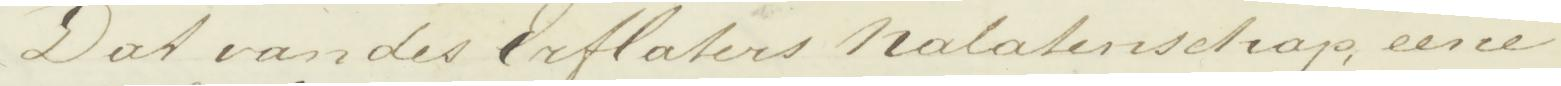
Dat van des Erflaters nalatenschap, eene
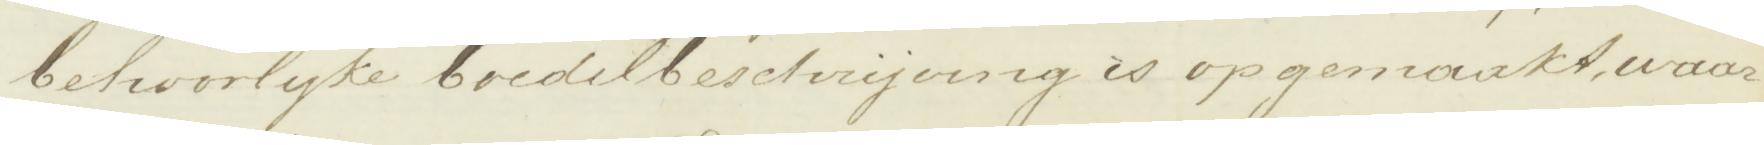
behoorlyke boedelbeschrijving is op gemaakt, waar
